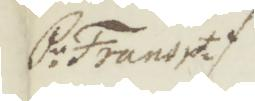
P:r Transp„t ƒ
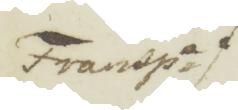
Transp„r ƒ
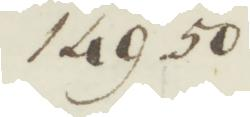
149.50
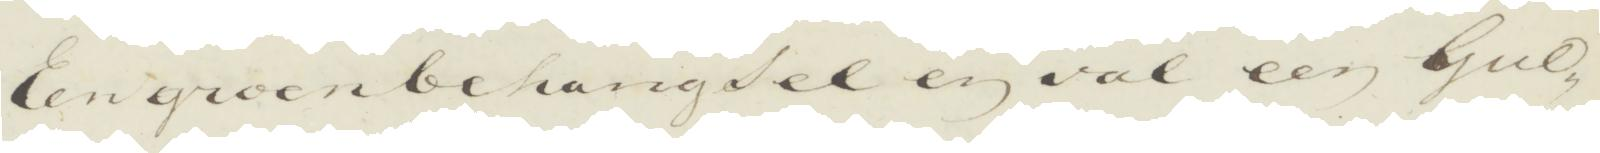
Een groen behangsel en val een Gul„
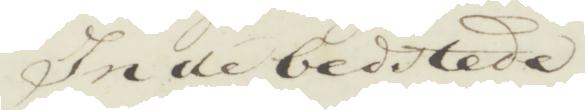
In de bedstede
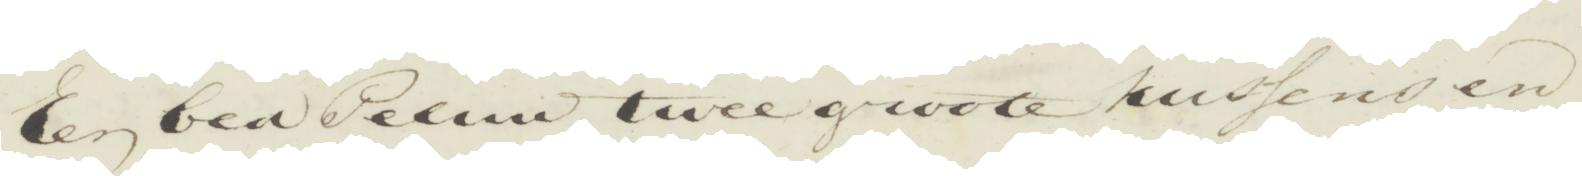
Een bed Peluw, twee groote kussens en
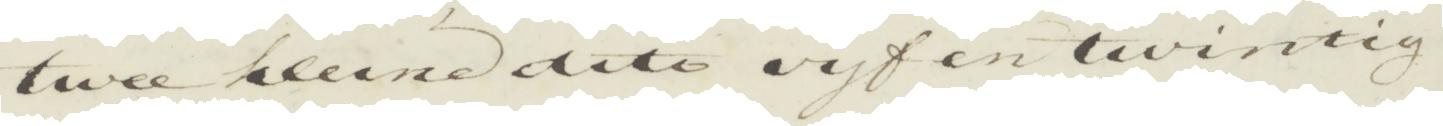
twee kleine dito vyf en twintig
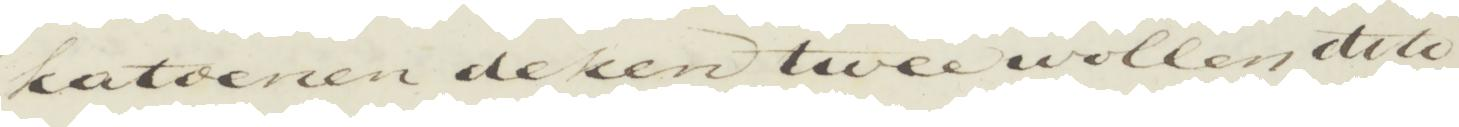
katoenen deken twee wollen dito
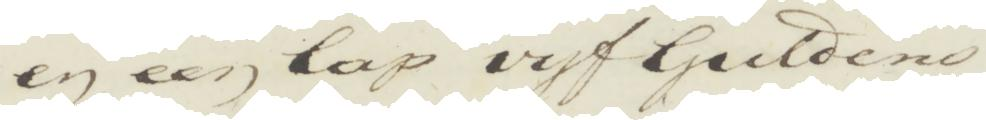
en een lap vyf Guldens
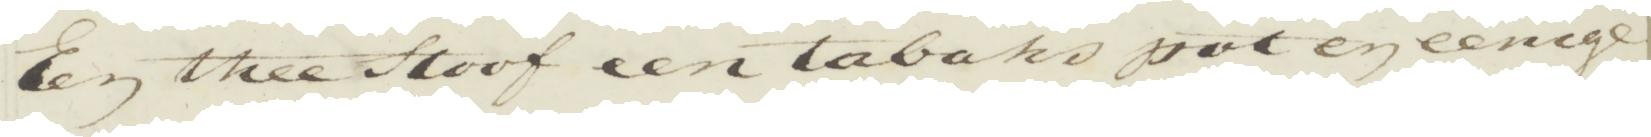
Een thee stoof een tabaks pot en eenige
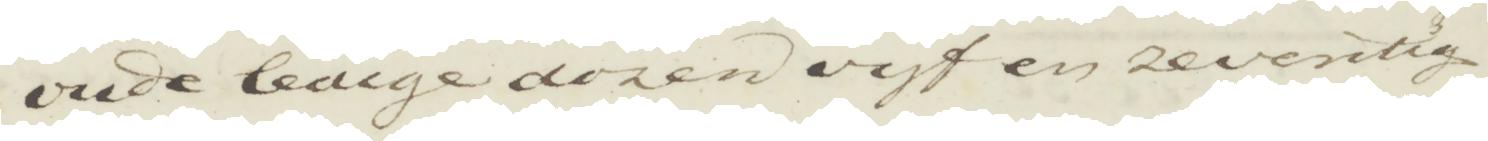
oude ledige dozen vyf en zeventig
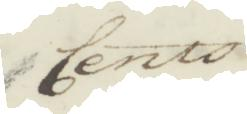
„ Cents
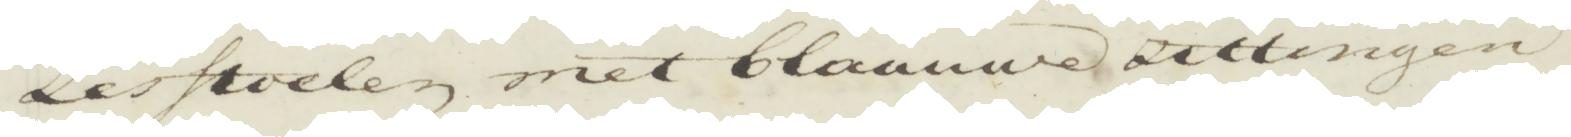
Zes stoelen met blaauwe zittingen
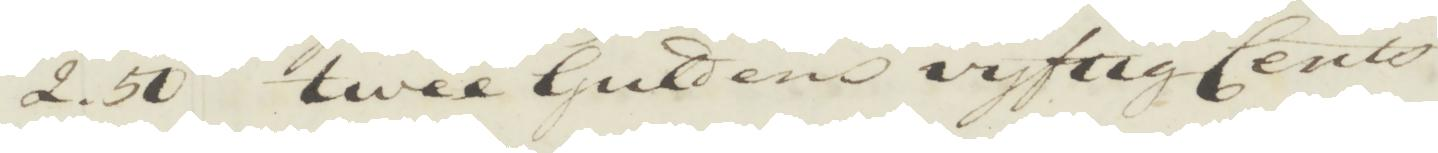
2.50 twee Guldens vyftig Cents
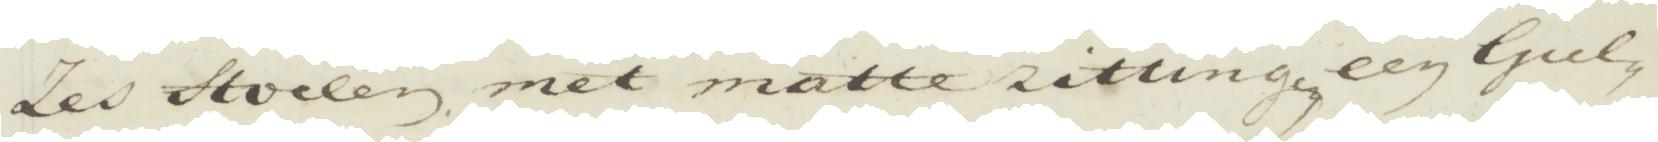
zes stoelen, met matte zittingen een Gul„
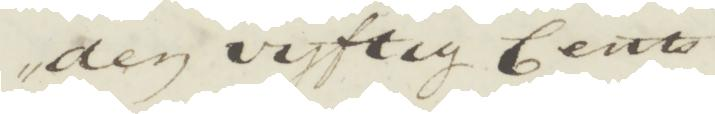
„den vyftig Cents
